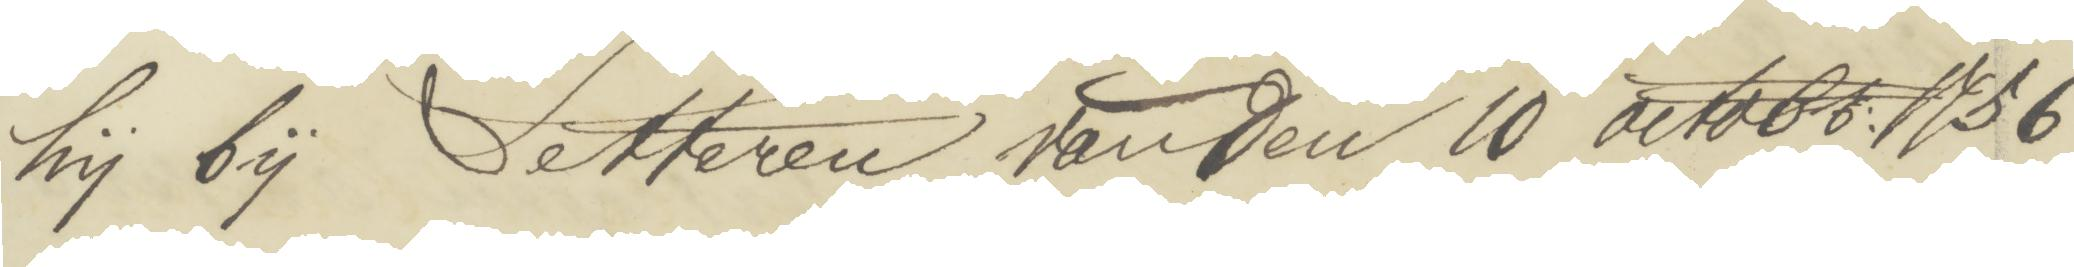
hij bij Letteren van den 10 octobs: 1756
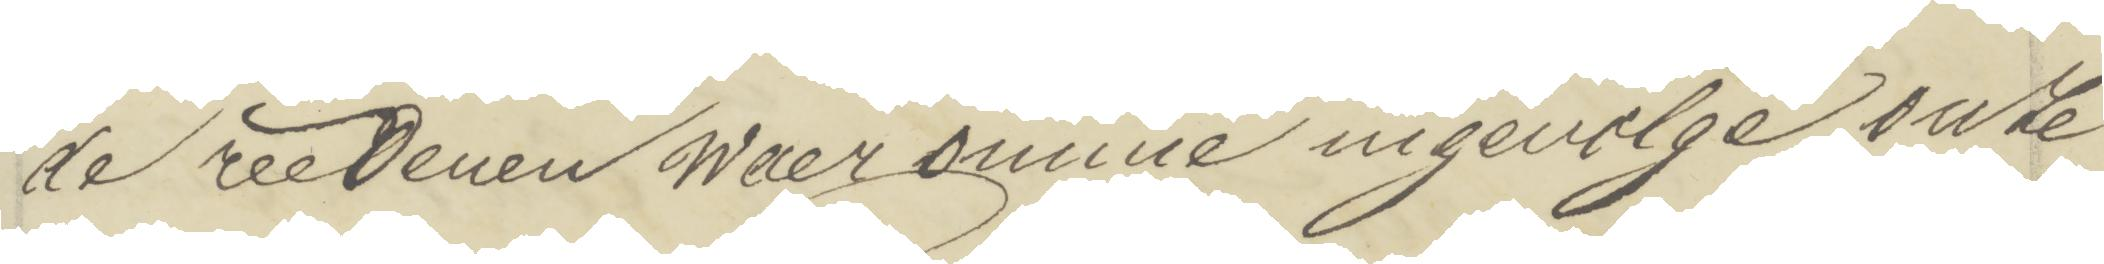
de reedenen waer omme ingevolge onze
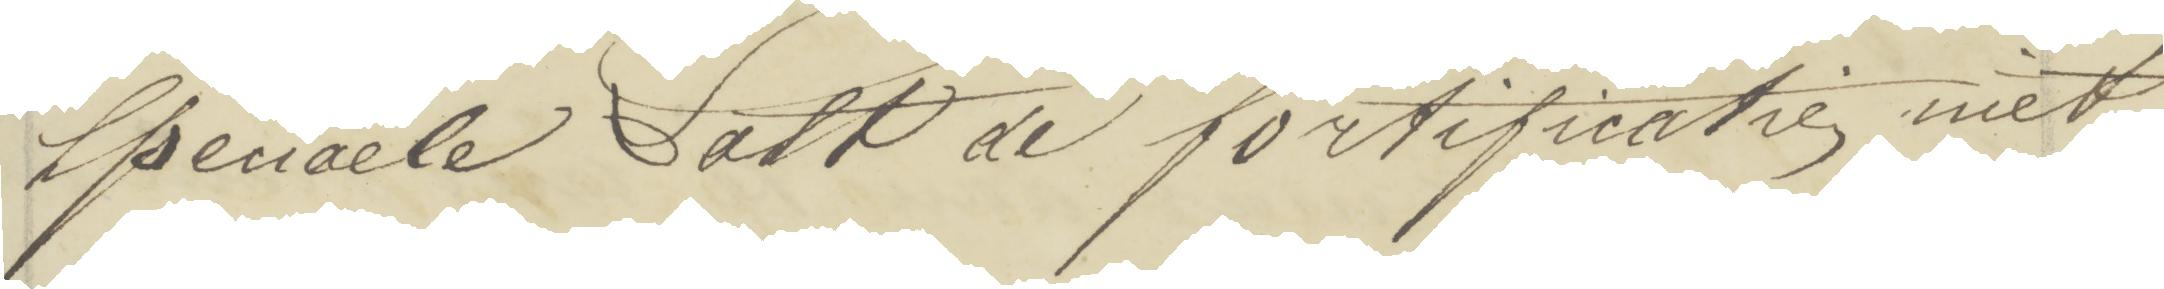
speciaele Last de fortificatien niet
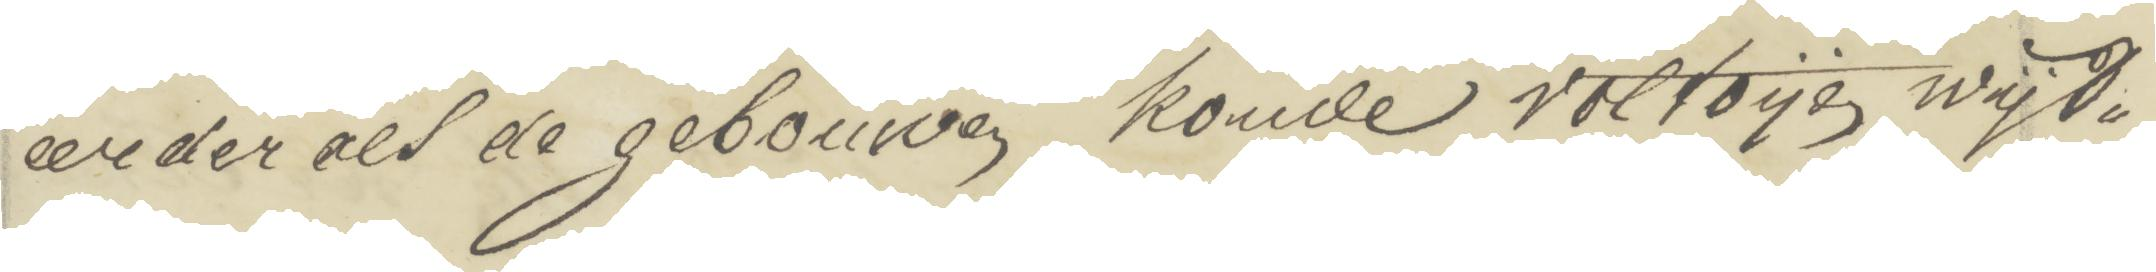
eerder als de gebouwen konde voltoijen wijd„
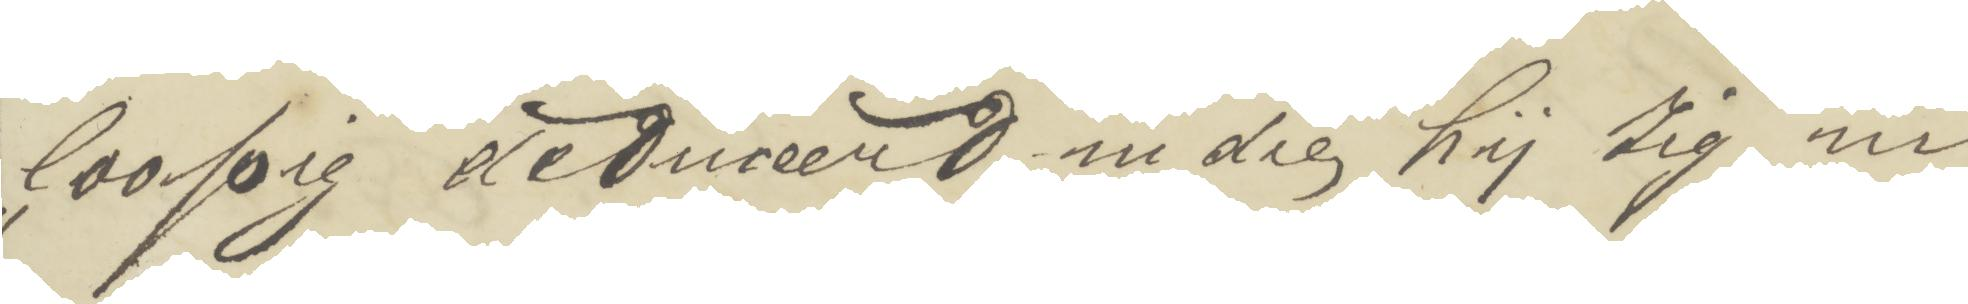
„loopig deduceerd in dien hij zig in
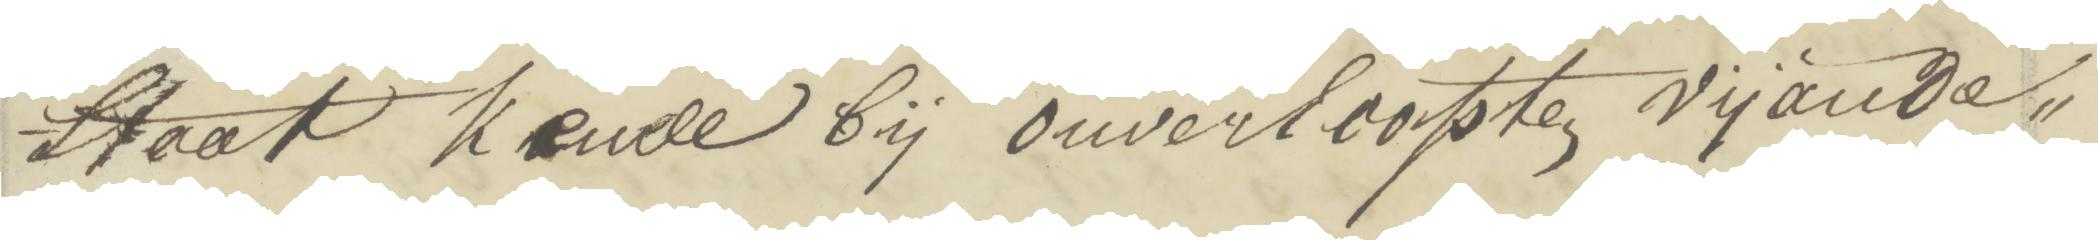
staat kende bij onverhoopten vijande„
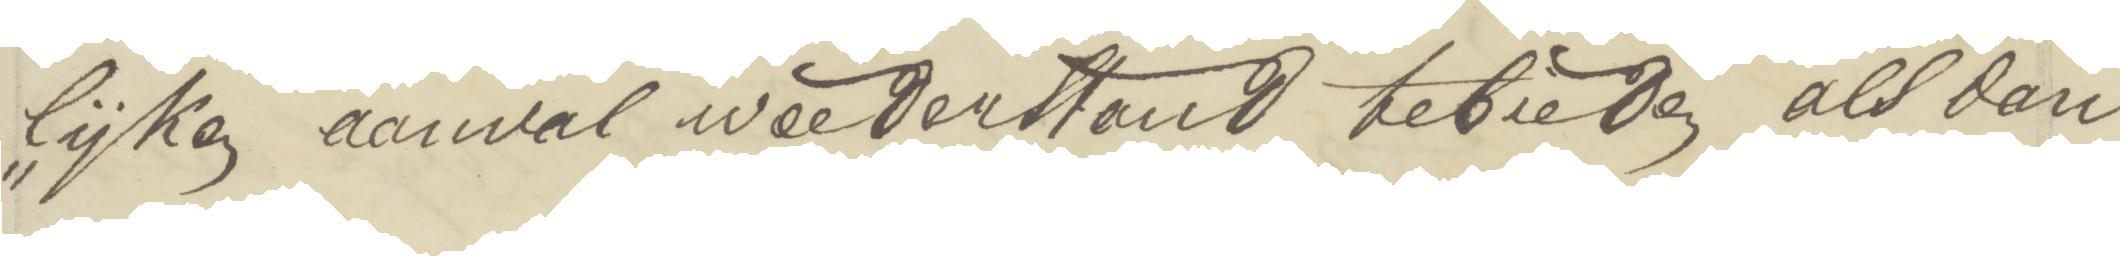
„lijken aanval weederstand tebieden als dan
